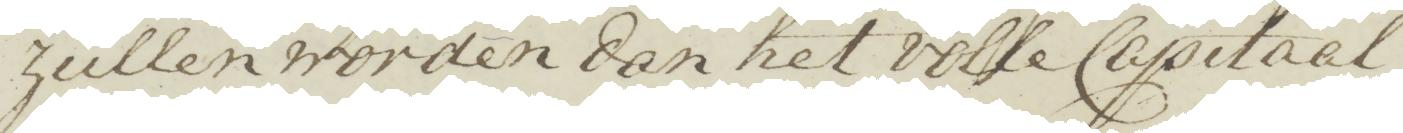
zullen worden dan het volle Capitaal
